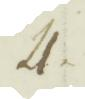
„ 4„
